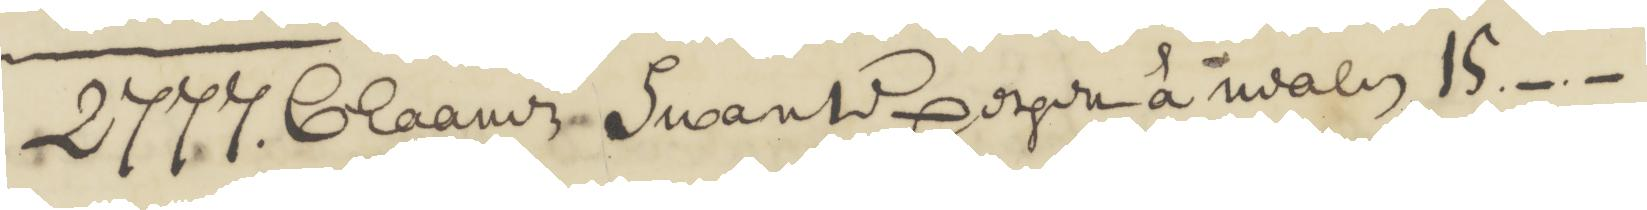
2777. bhaaren swarte peper â realen 15._._
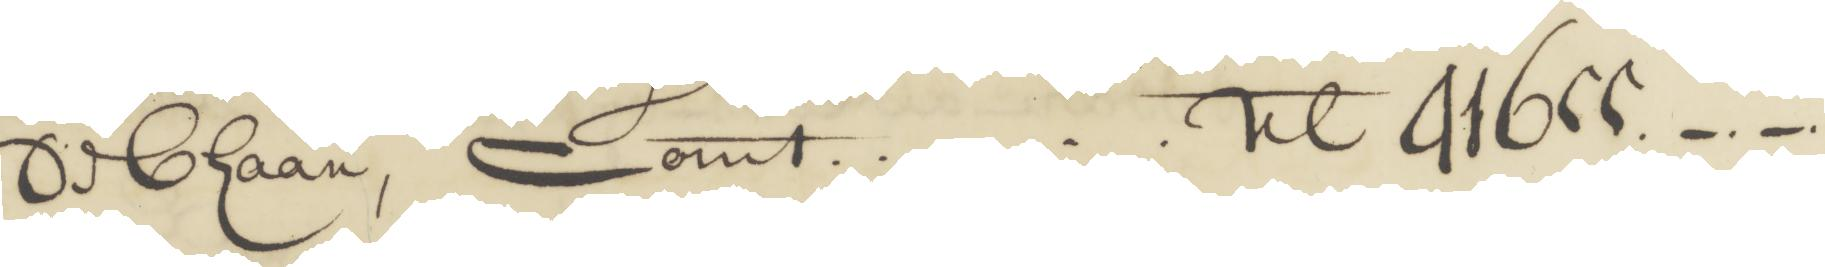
de bhaar, comt . . . . . rl 41655._._
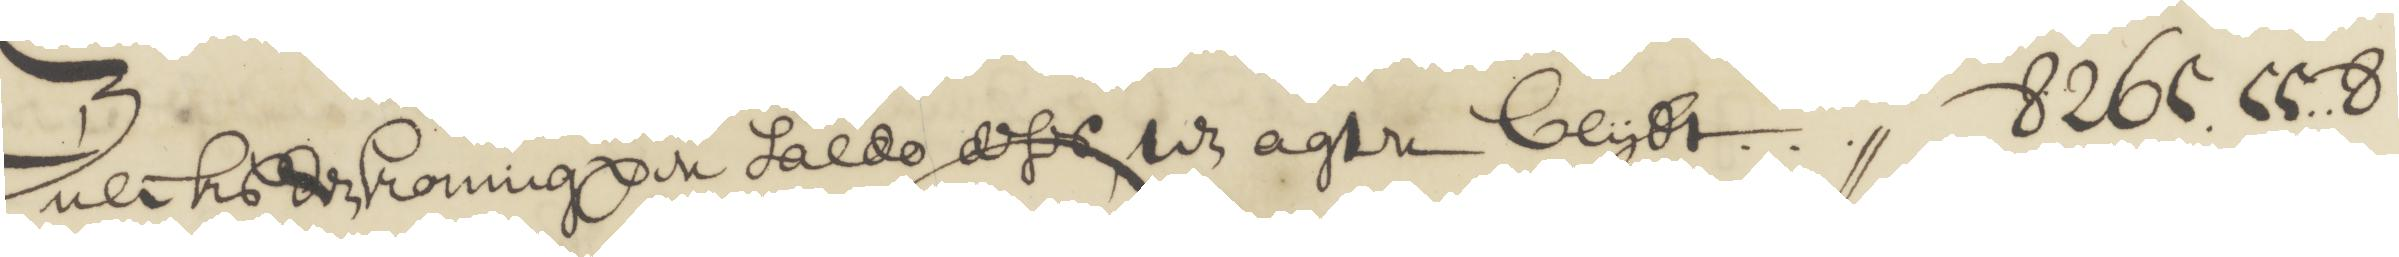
Zulcks den koning per saldo deses, ten agter blijft . . . „ 8265.55..8
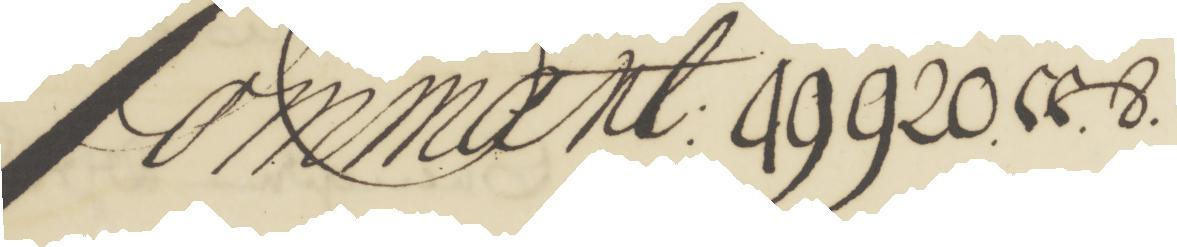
Somma rl: 49920.55.8.
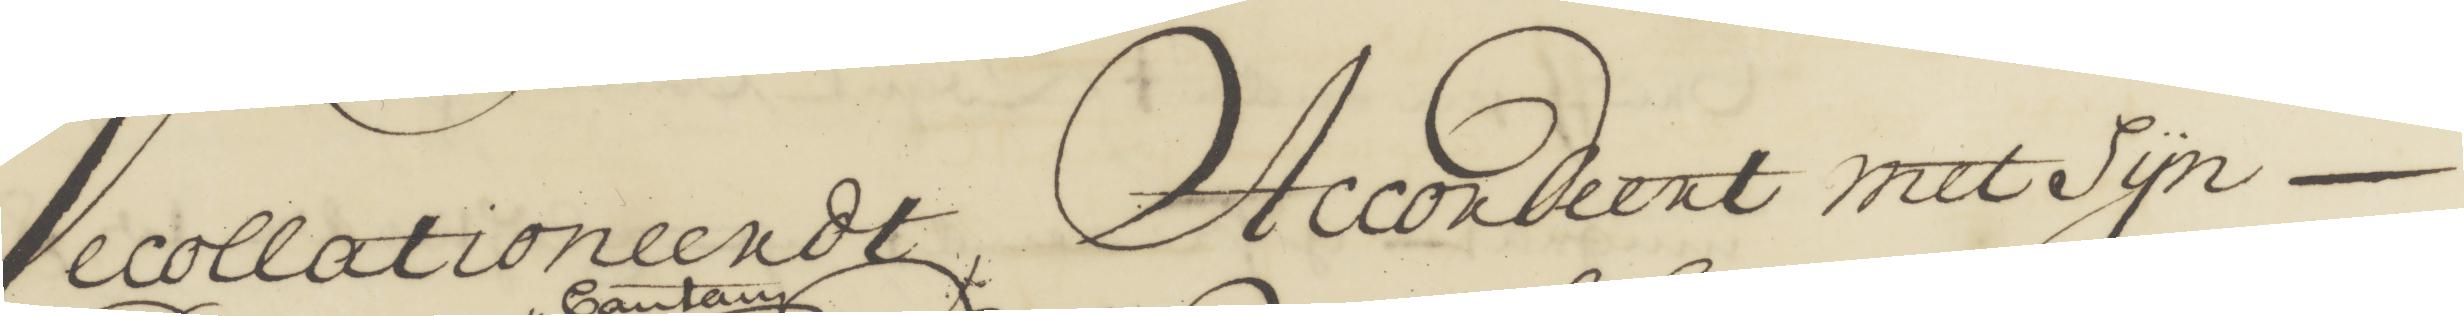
Gecollationeerdt Accordeert met sijn _
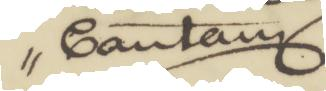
„ bantam
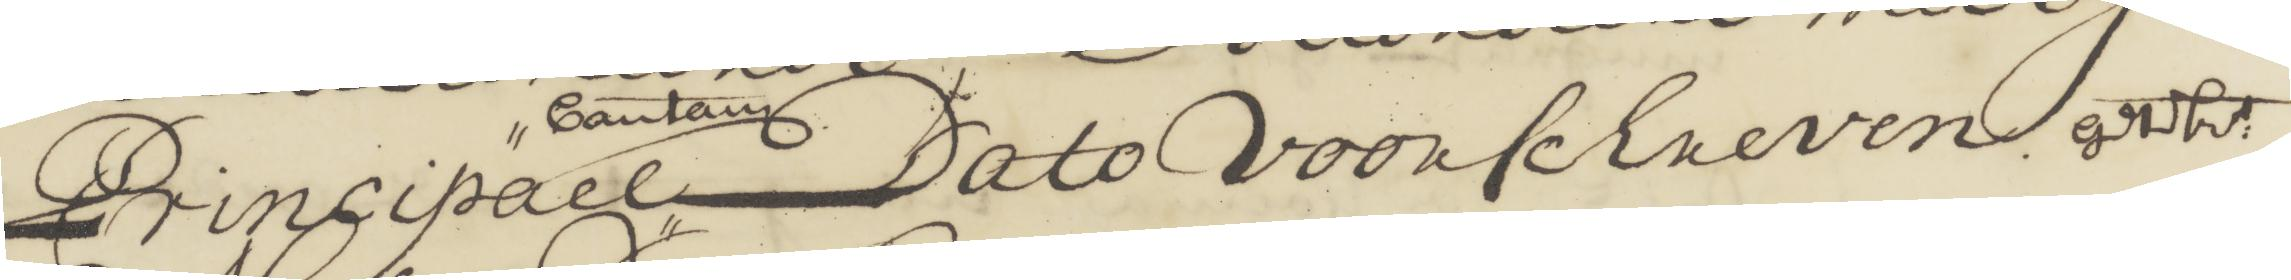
Principael„ Dato voorschreven getek:t
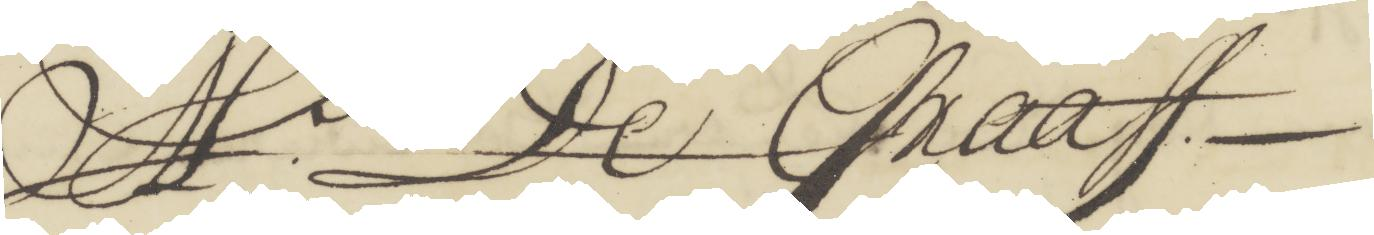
M:s De Graaff. _
